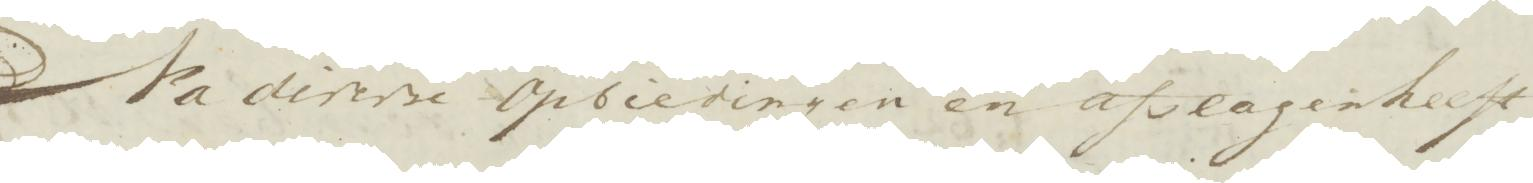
Na diverse opbiedingen en afslagen heeft
